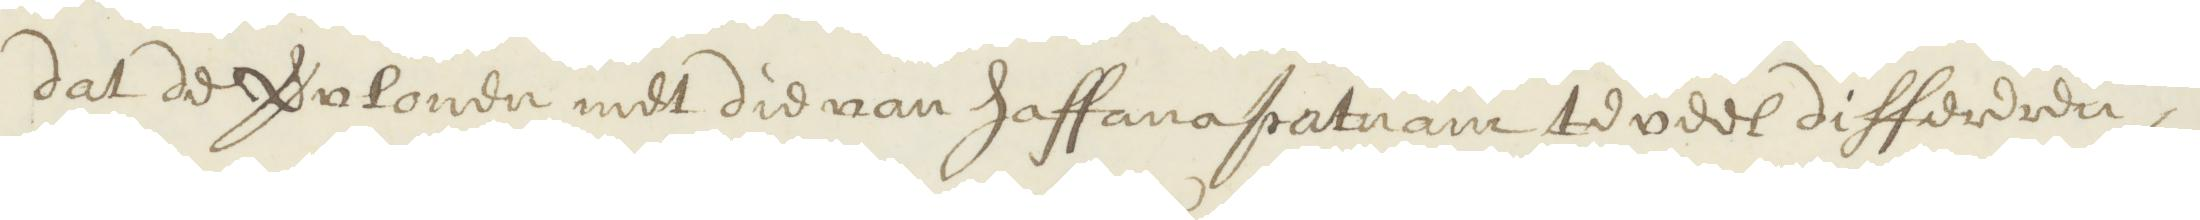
dat de vervlonen met die van Jaffanapatnam te veel differeren,
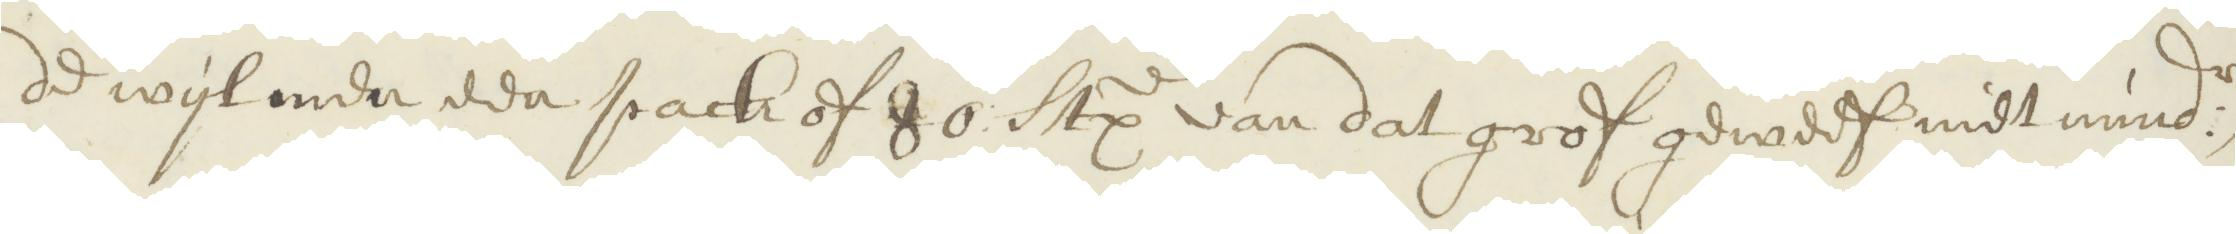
de wijl men een pack of 80: stx van dat grof geweef niet mind:r,
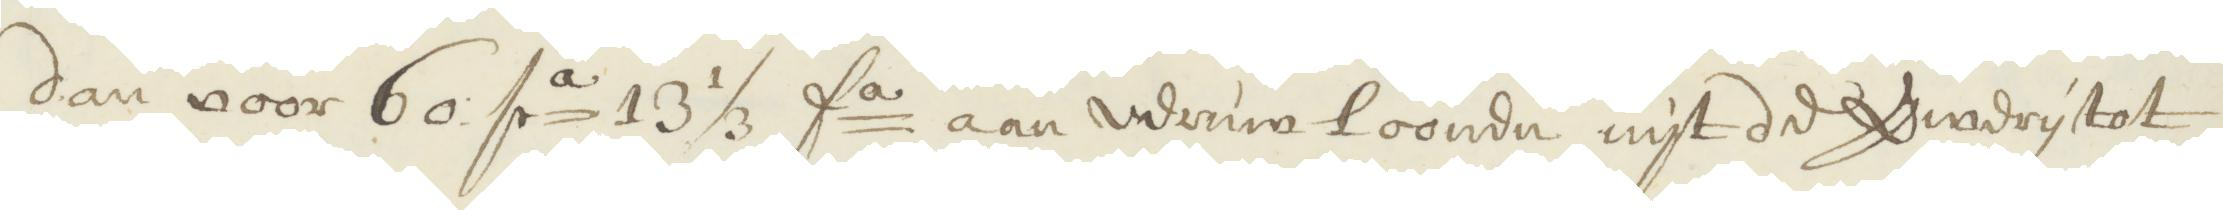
dan voor 60: p=a 13 1/3 f=a aan veruw loonen uijt de verwerij tot
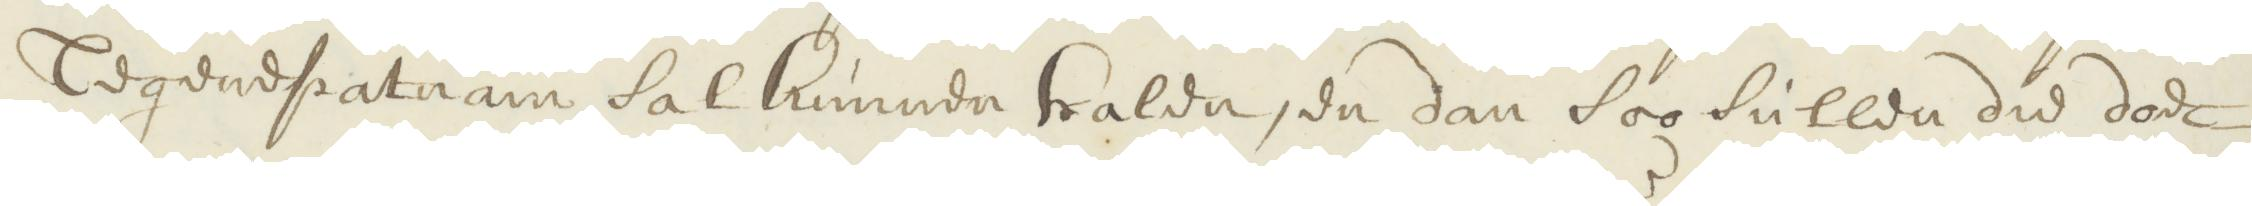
Tegenepatnam sal kunnen halen, en dan soo sullen die doec
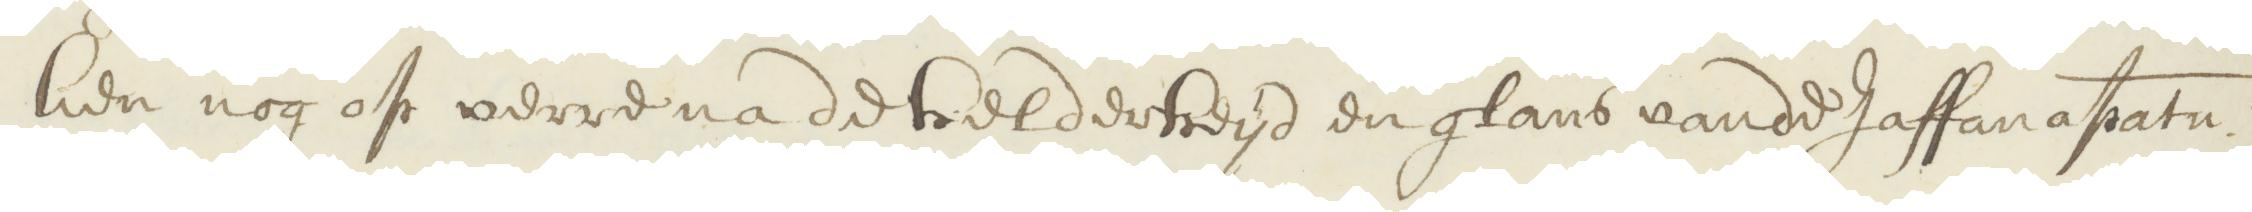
ken nog op verre na de helderheijd en glans vande Jaffanapatn:
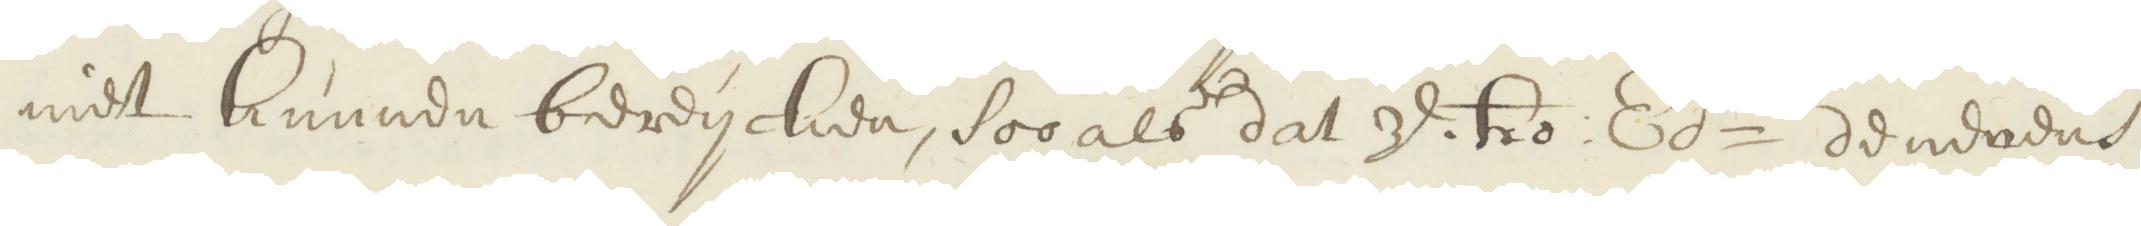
niet kunnen bereijcken, soo als dat V. ho: Ed=lns de nevens
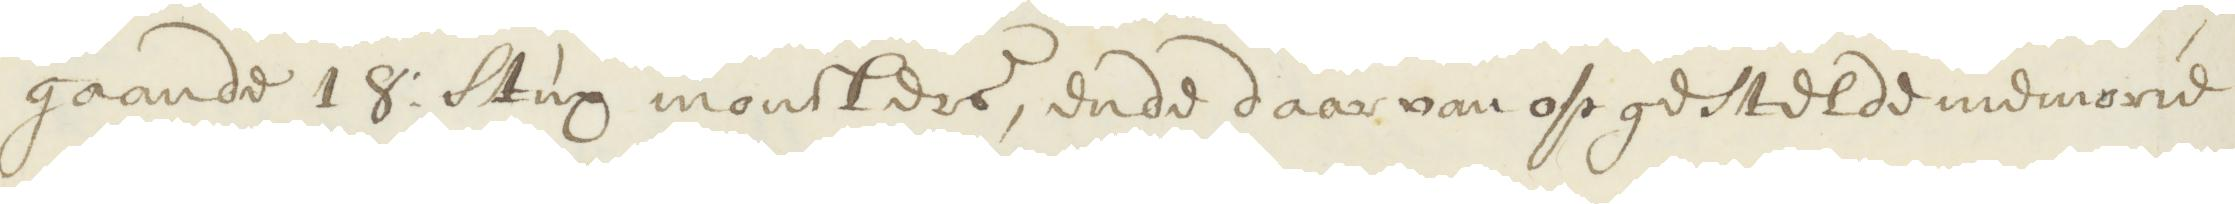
gaande 18: stux monsters, ende daar van op gestelde memorie
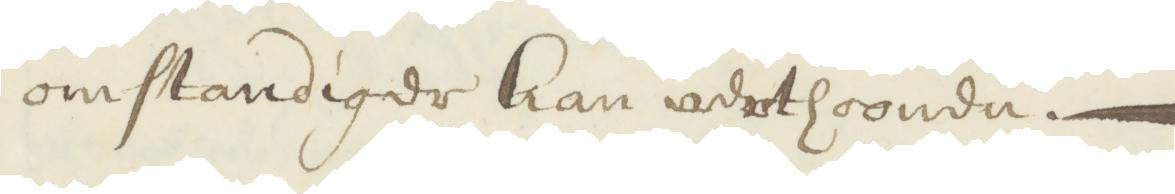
omstandiger kan verthoonen.
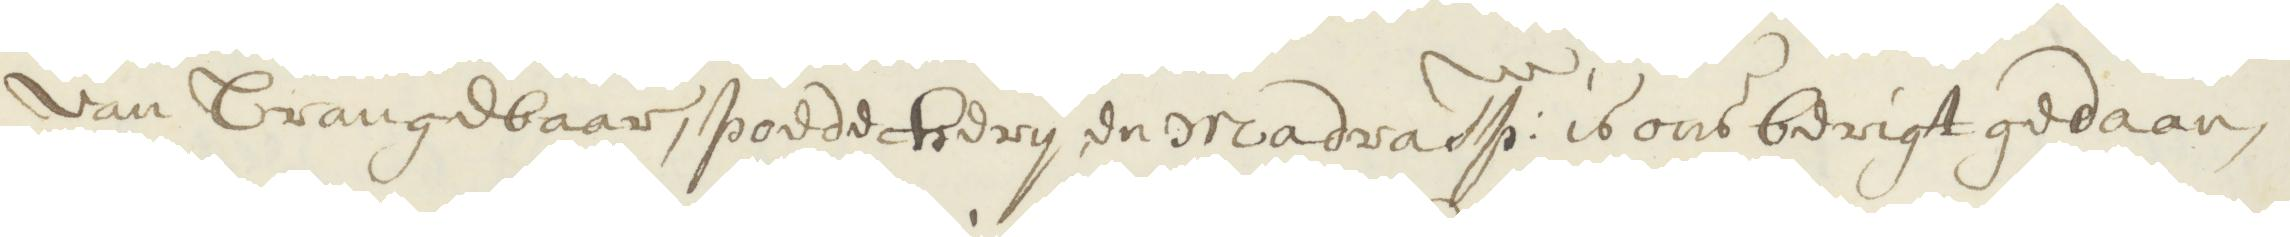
van Trangebaar, poedecherij en Madrasp: is ons berigt gedaan,
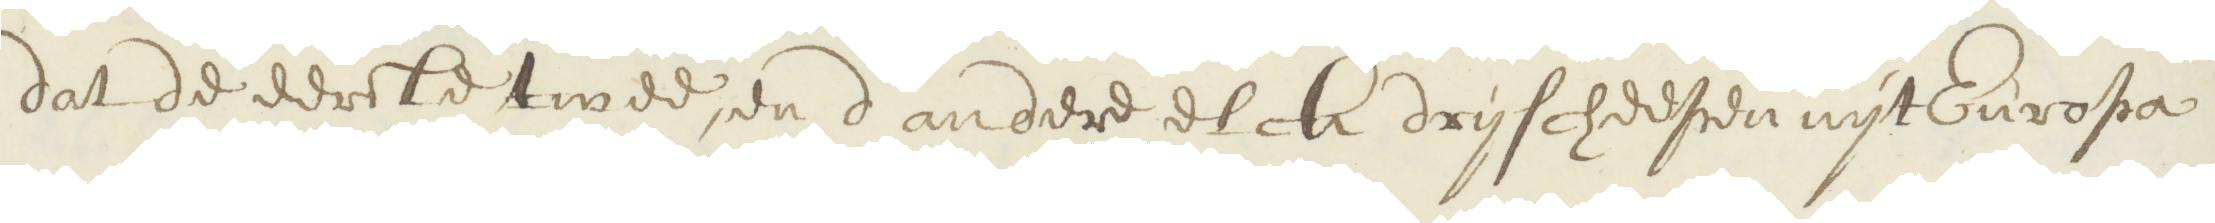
dat de eerste twee, en d' andere elck drijscheepen uijt Europa
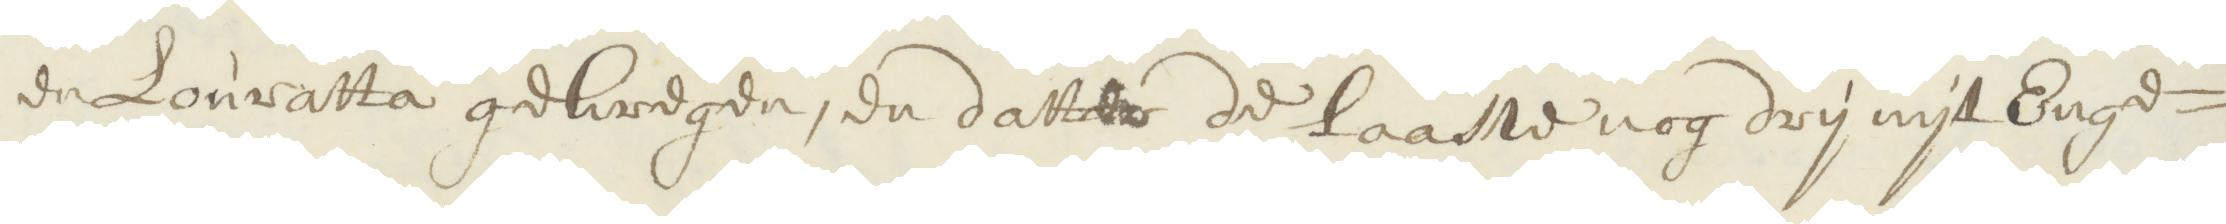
en Louratta gekregen, en datter de laaste nog drij uijt Enge=
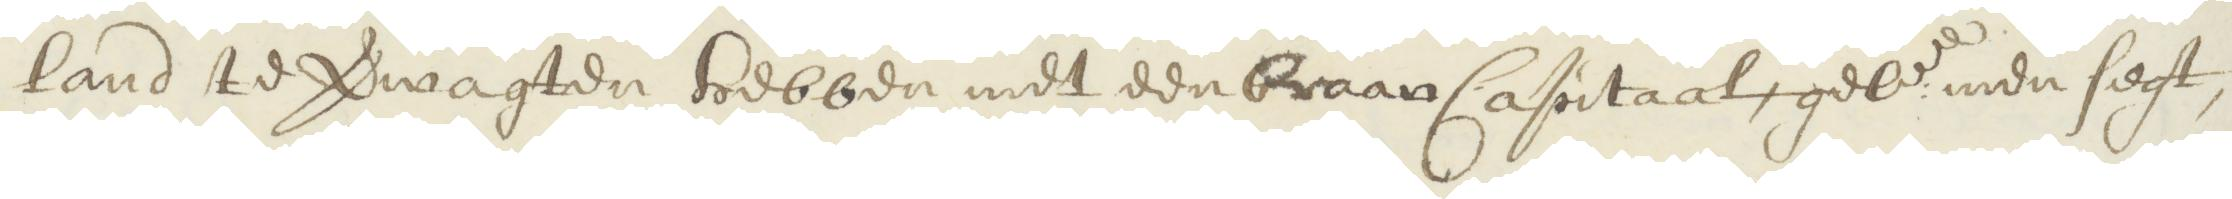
land te verwagten hebben met een braan Capitaal, gel:' men segt,
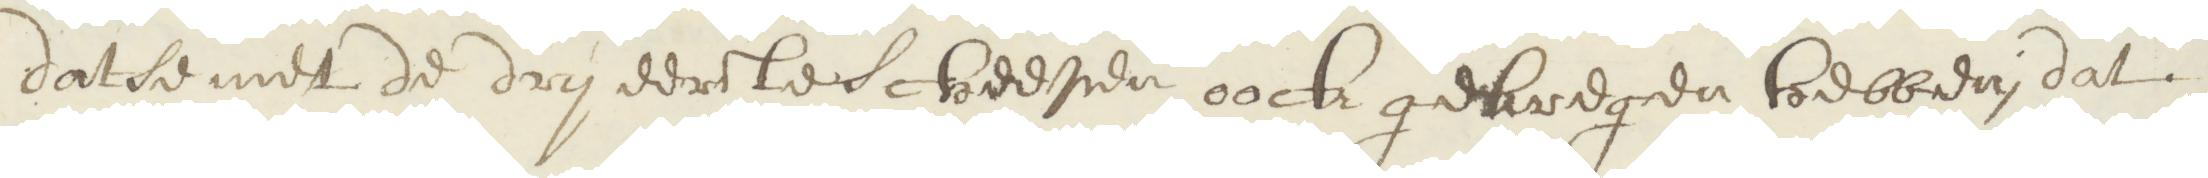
datse met de drij eerste scheepen oock gekregen hebben, dat
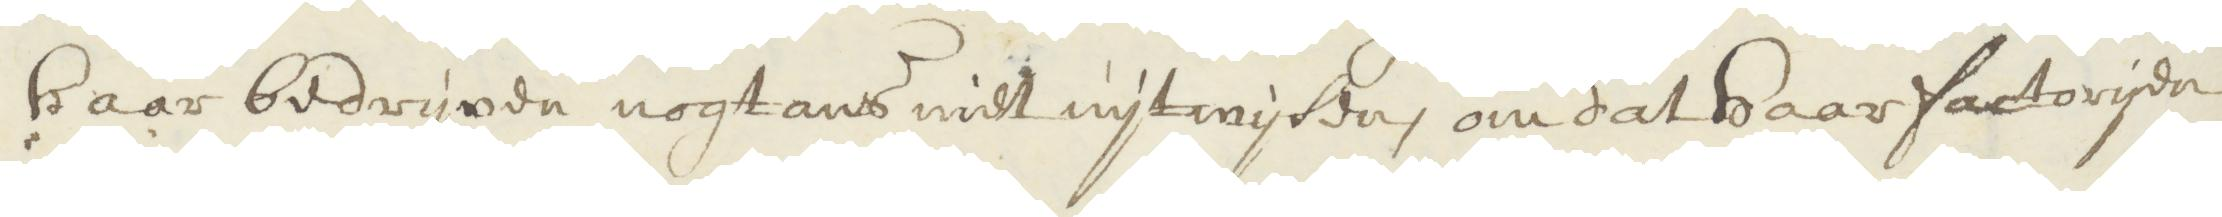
haar bedrijven nogtans niet uijtwijsen, om dat haar factorijen
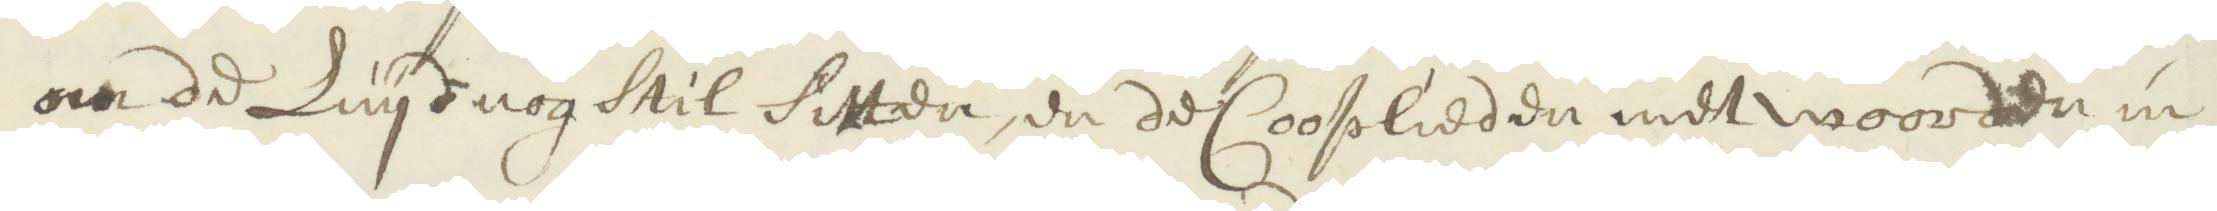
om de Luijd nog stil sitten, en de Cooplieden met woorden in
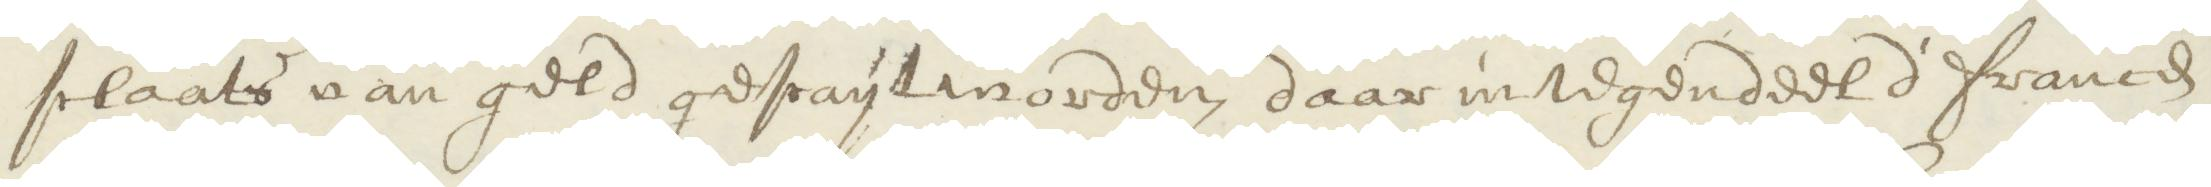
plaats van geld gepaijt worden, daar in tegendeel d’ francen
